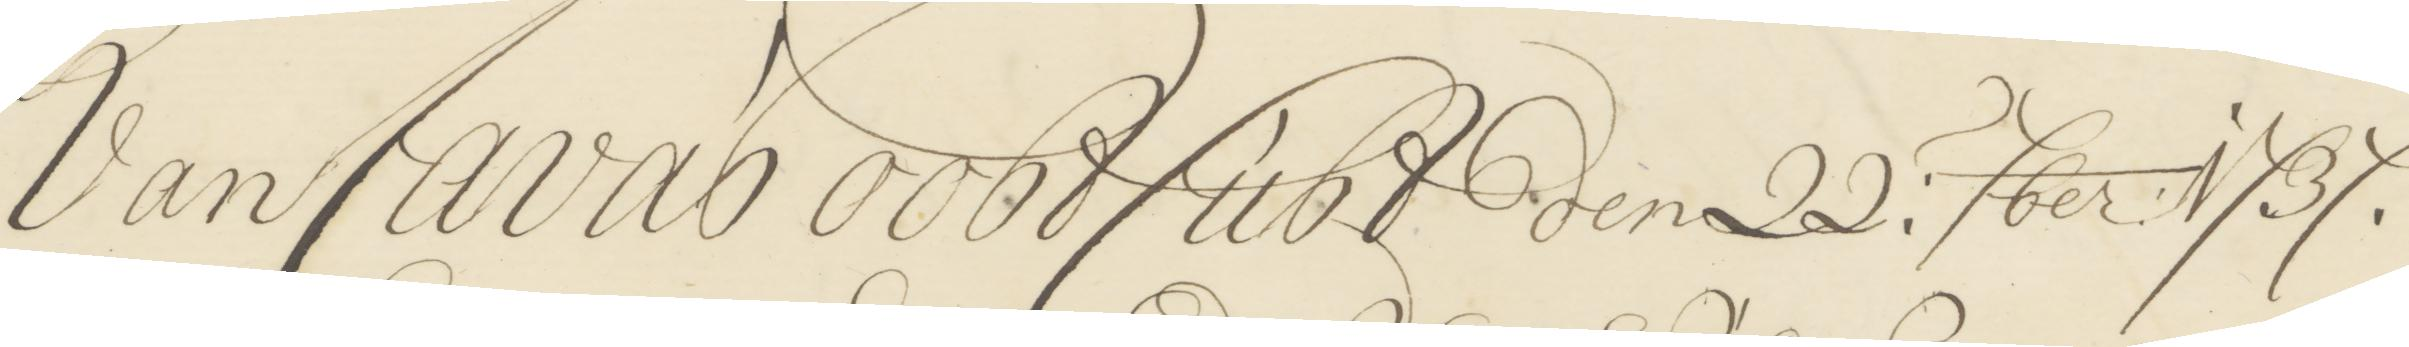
Van Java's oost Cust den 22:' 7ber: 1737.
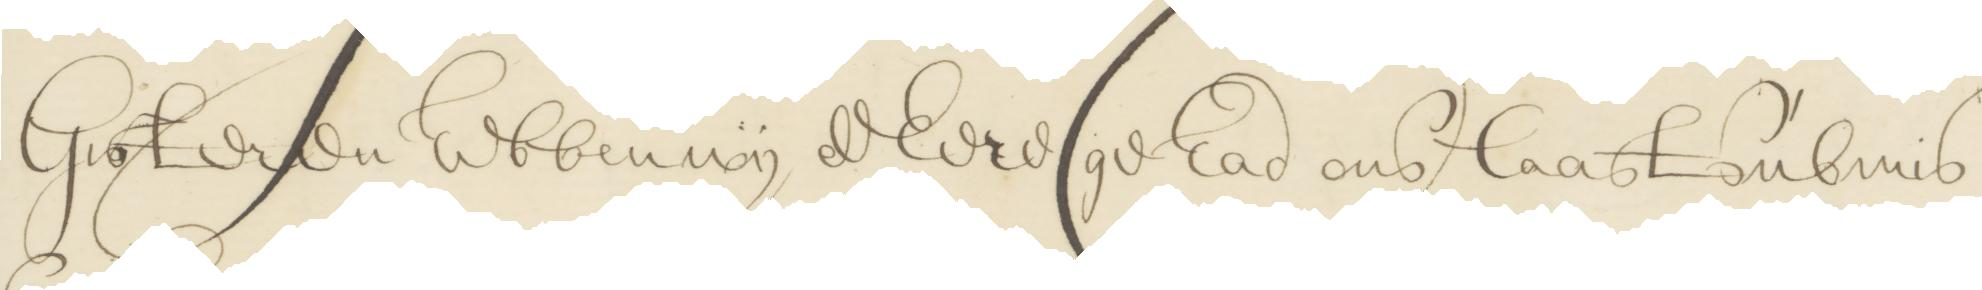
Gisteren hebben wij de Eere gehad ons laast submis
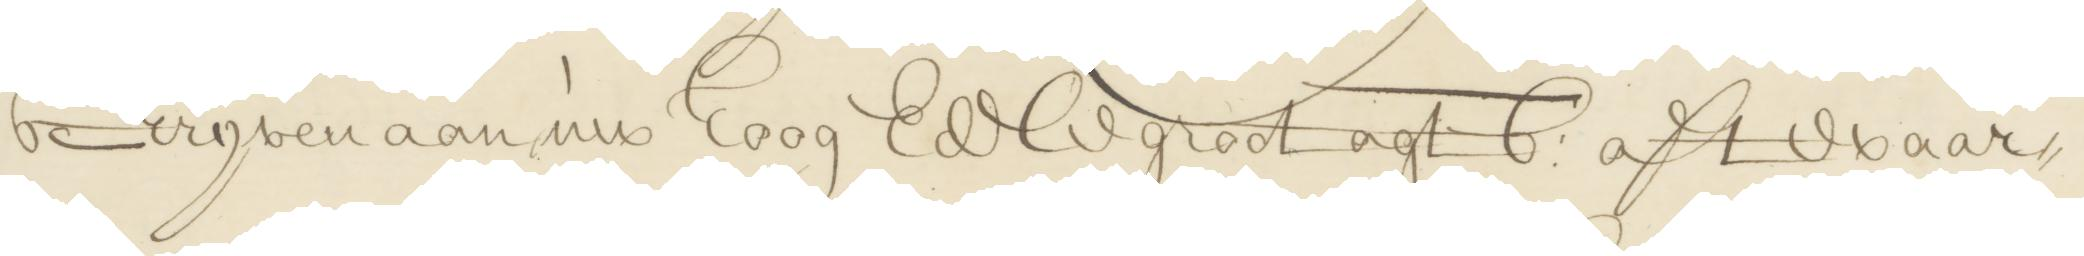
schrijven aan uw hoog Edele groot agtb: aftevaar„
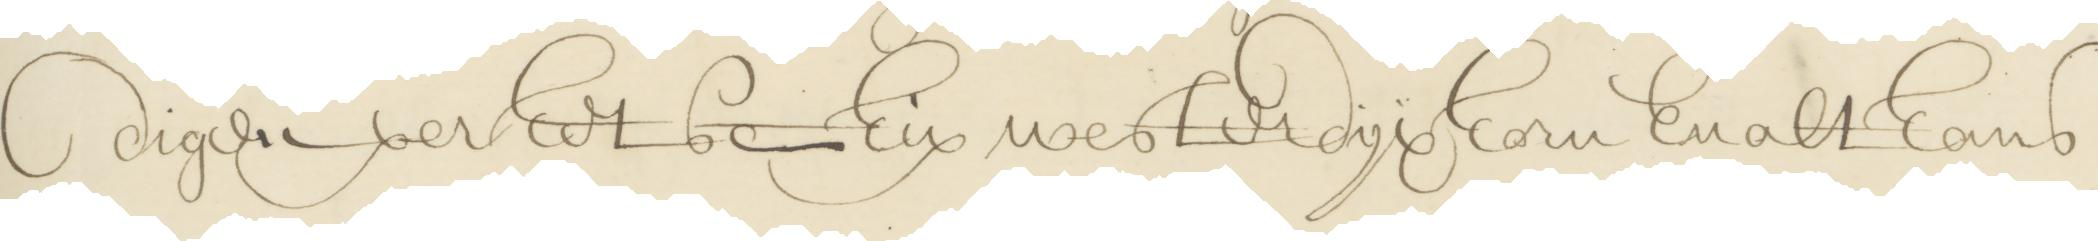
digen per het schip westerdijxhorn En althans
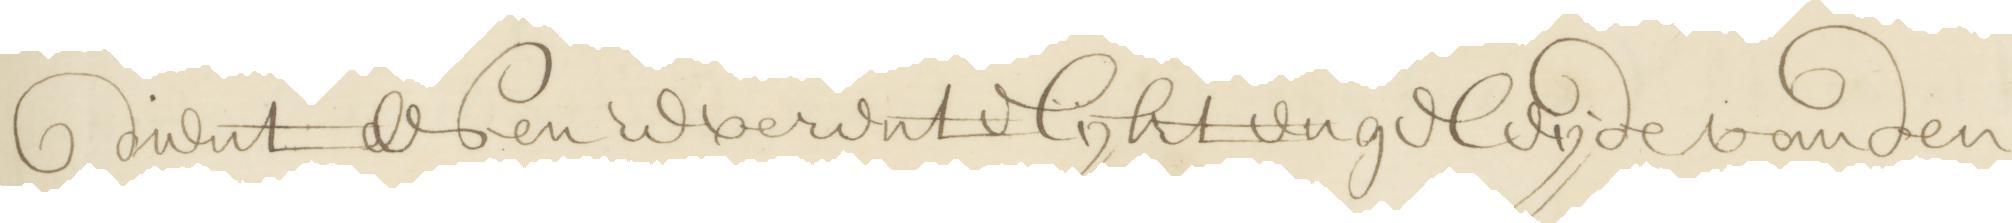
dient desen reverentelijkten geleijde van den
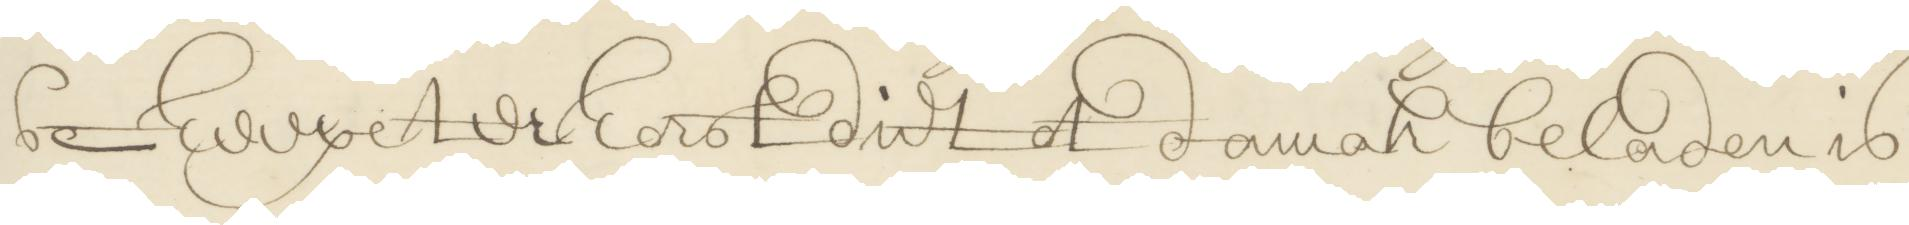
scheepe ter horst die tot damak beladen is
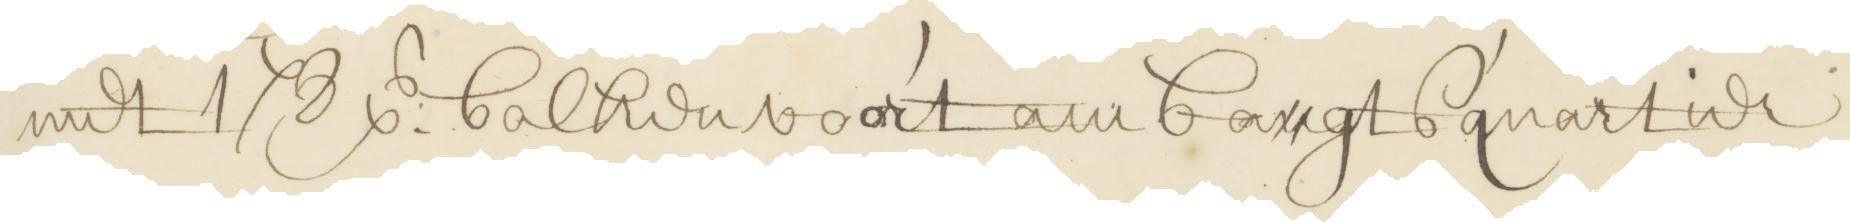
met 178 p:s balken voor't ambagts quartier
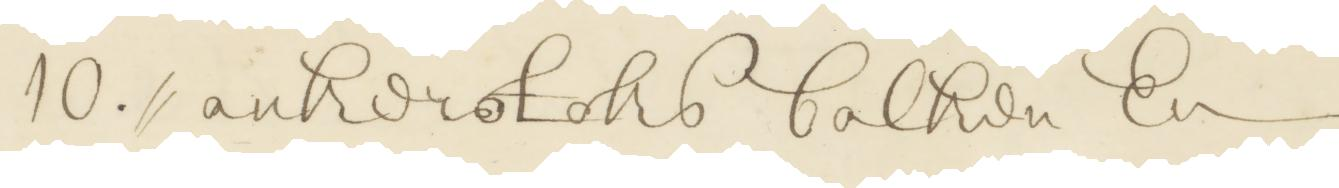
10. „ ankerstoks balken En
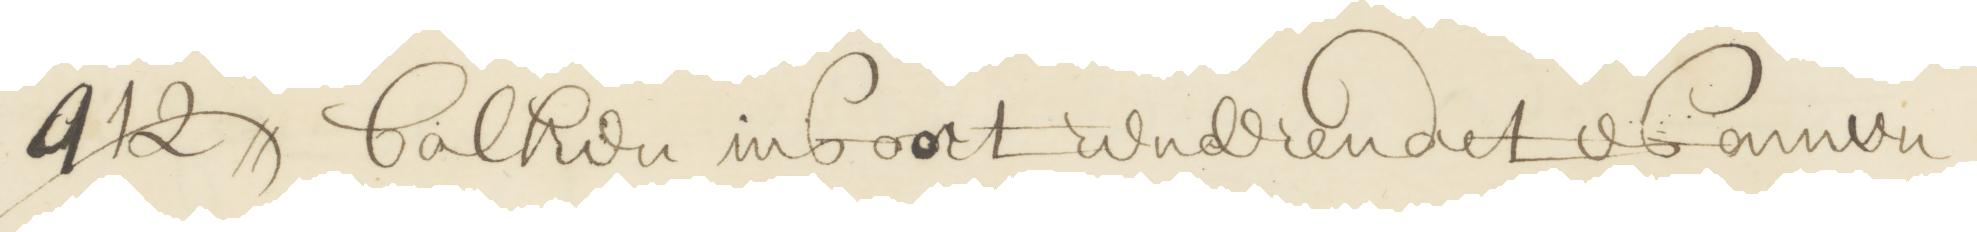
412 „ balken insoort renderendetesamen
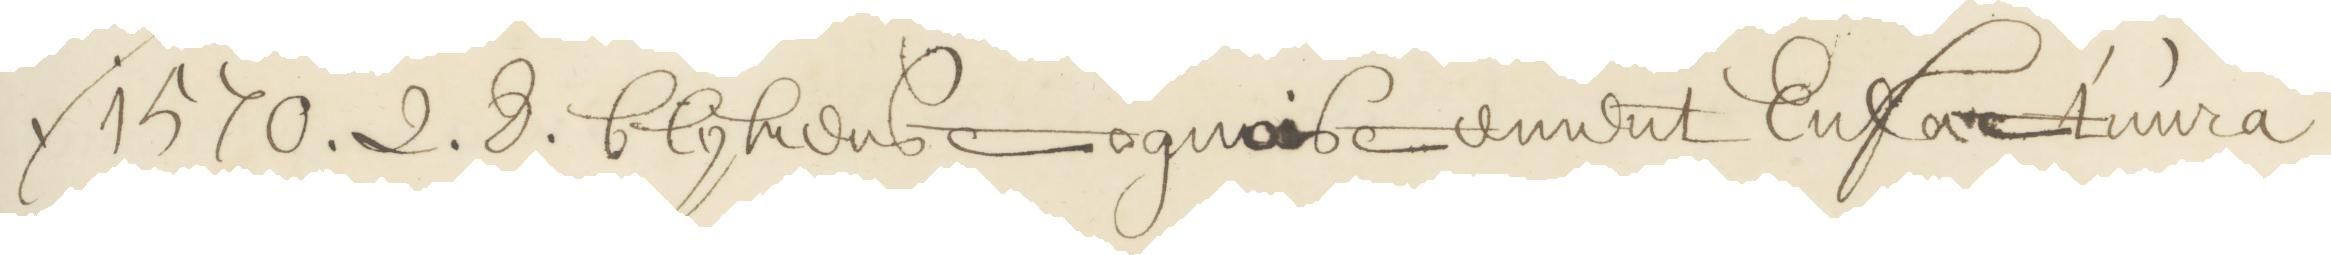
ƒ1570.2.8. blijkens cognoiscement Enfactuura
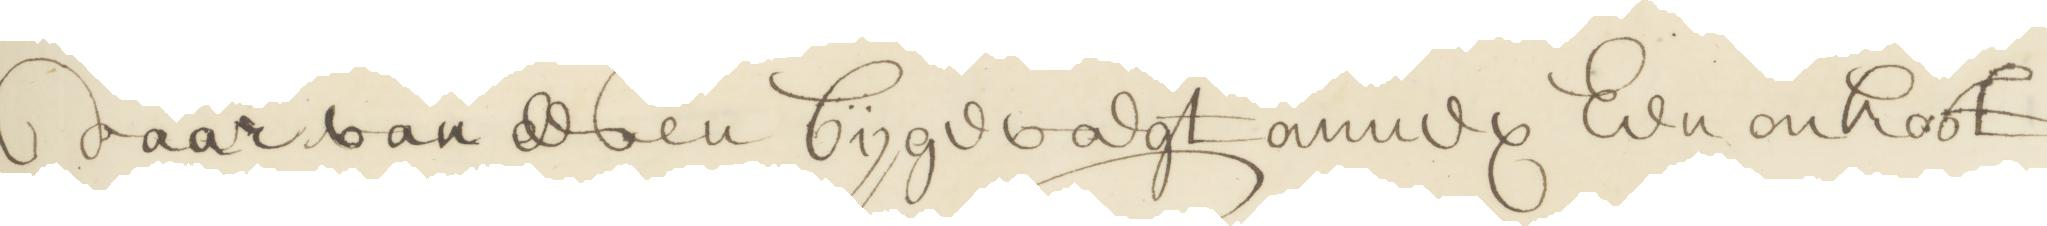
daar van desen bijgevoegt annex Een onkost
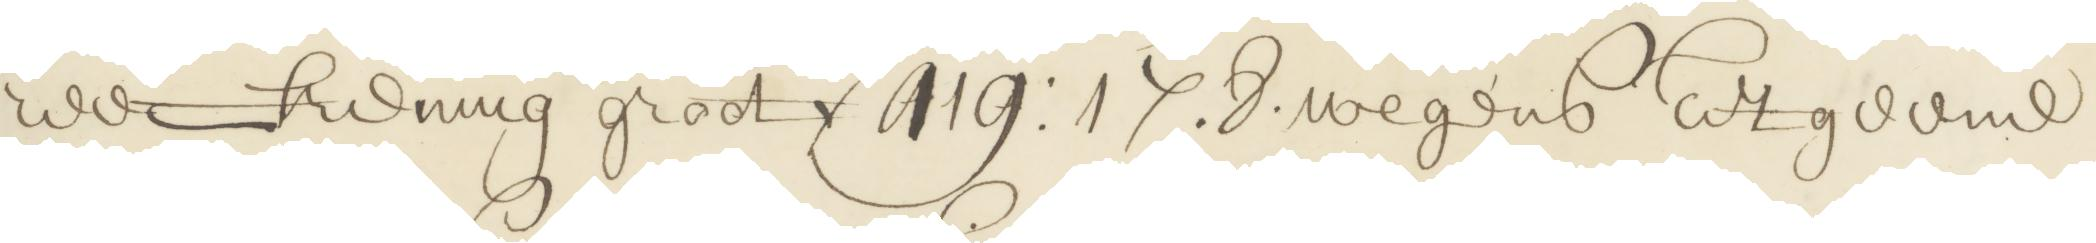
reeckening groot ƒ419:17.8. wegens het geene
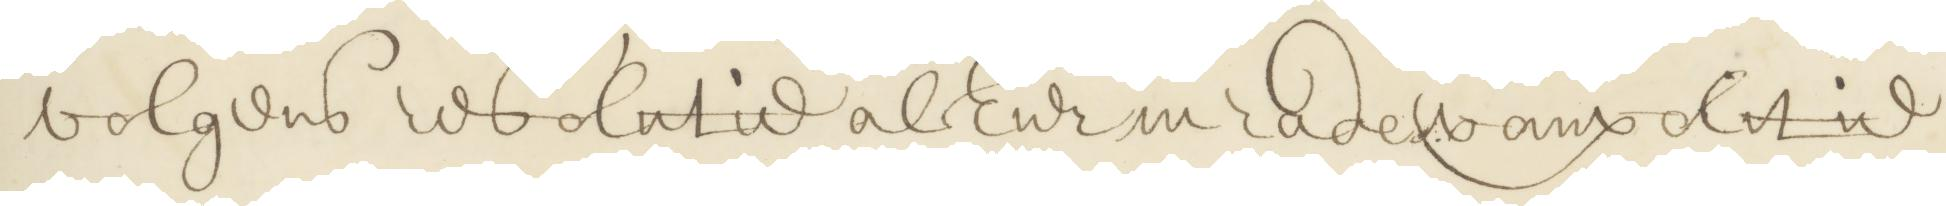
volgens resolutie alhier in rade van politie
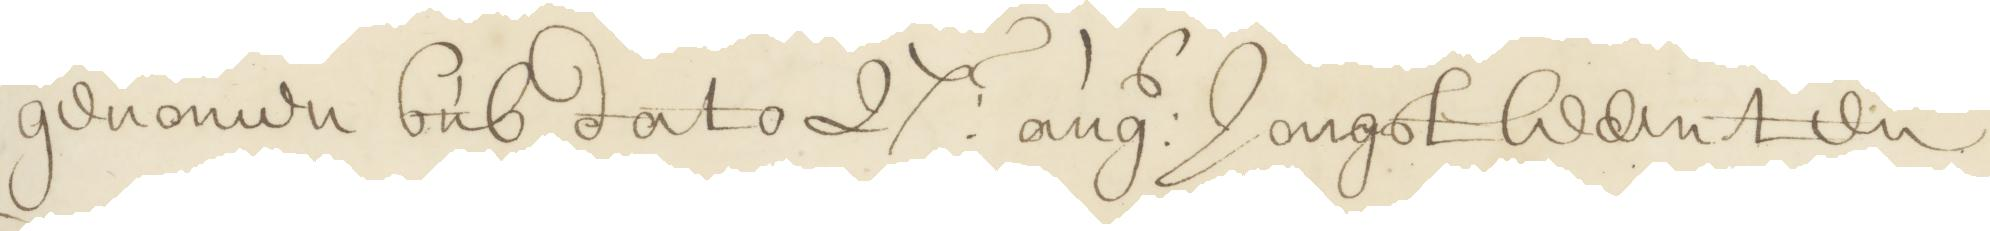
genomen sub dato 27:' aug:s Jongstleden ten
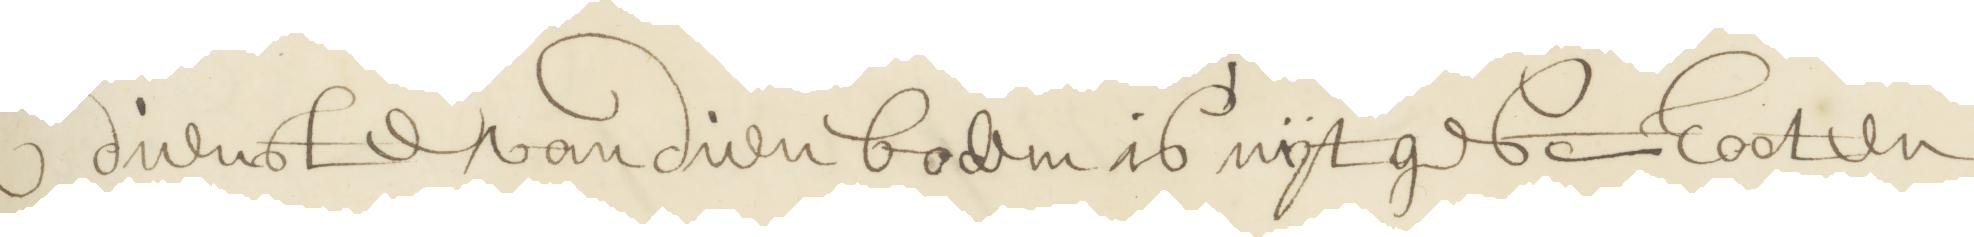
dienste van dien bodem is uijtgeschooten
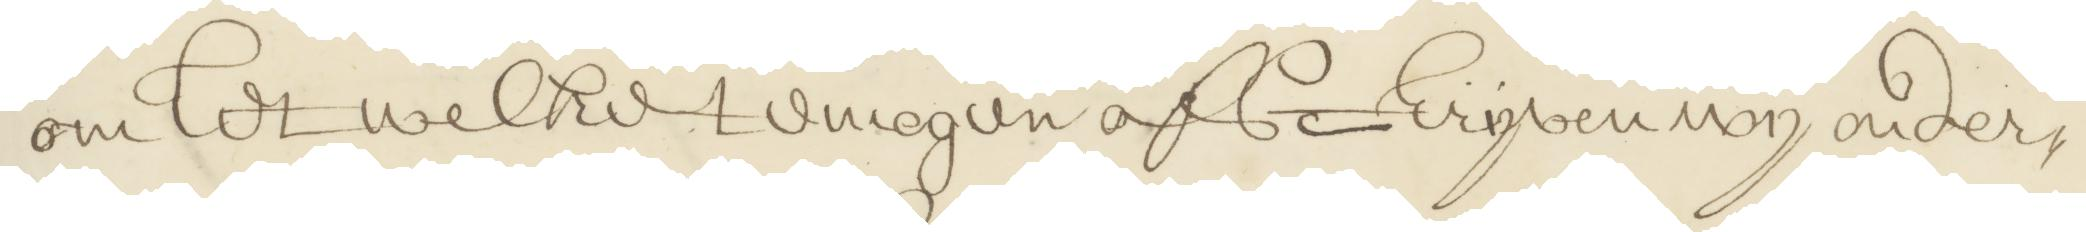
om hetwelke temogen afschrijven wij onder„
